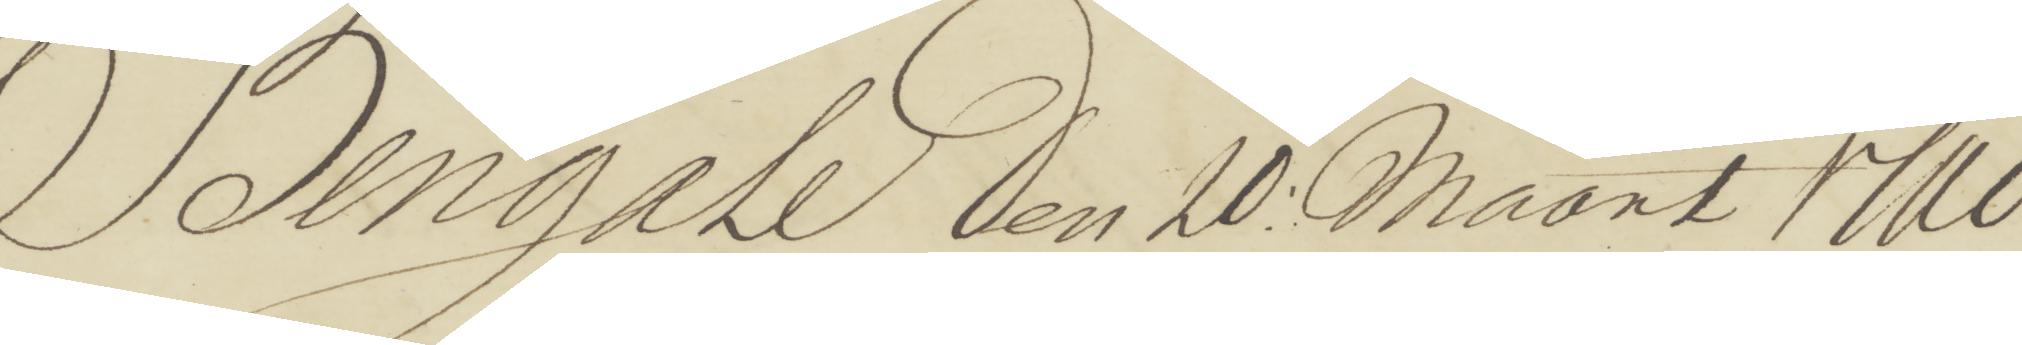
Van Bengale den 20:' Maart 1740
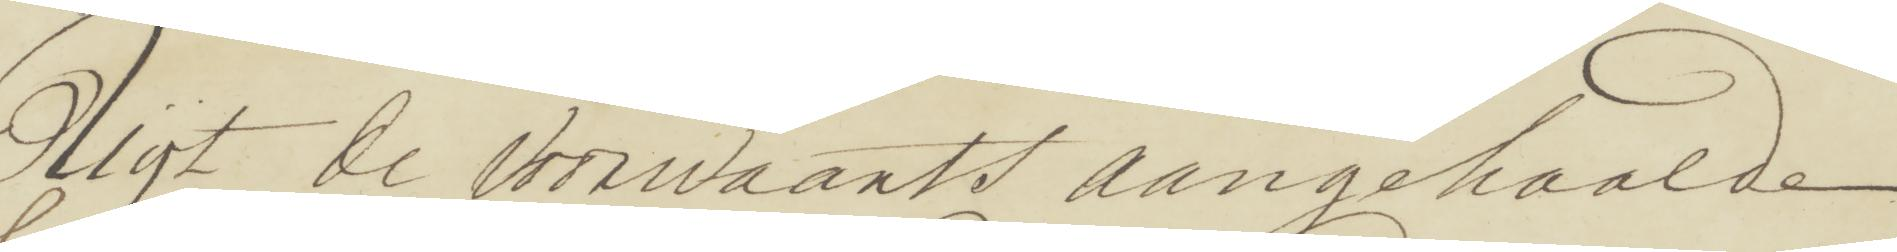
Rigt de voorwaarts aangehaalde
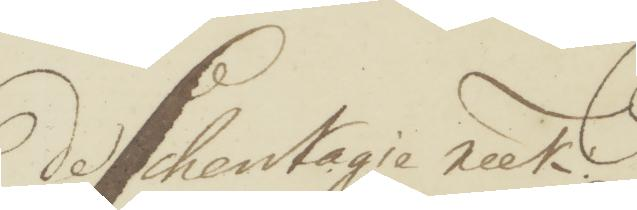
de schenkagie reek:
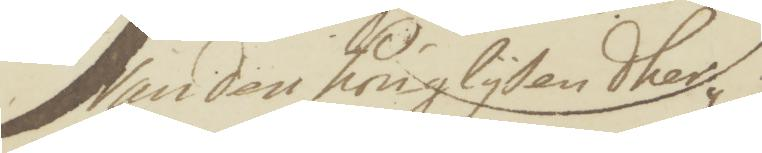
van den houglijsen dher„
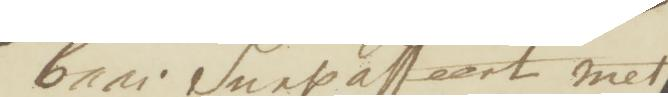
baar surpasseert met
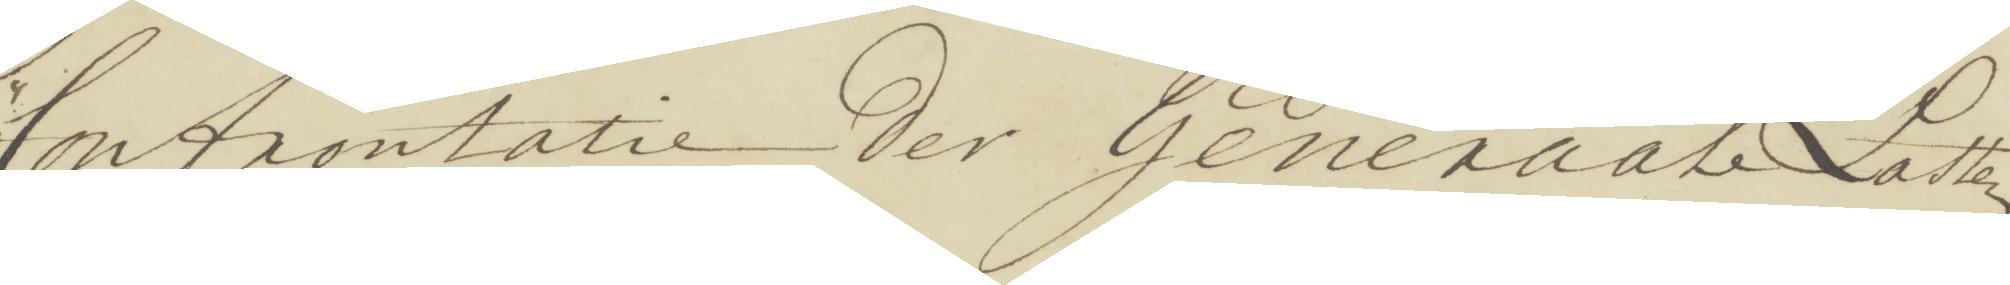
Confrontatie der Generaal Lasten
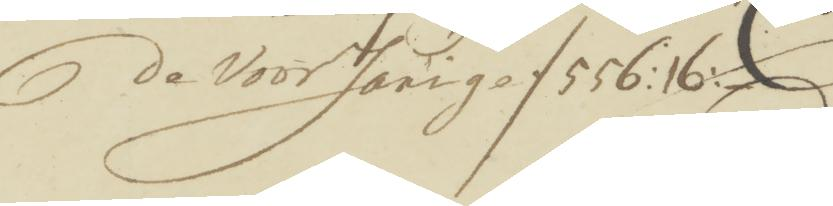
de voorjarige ƒ556:16:–
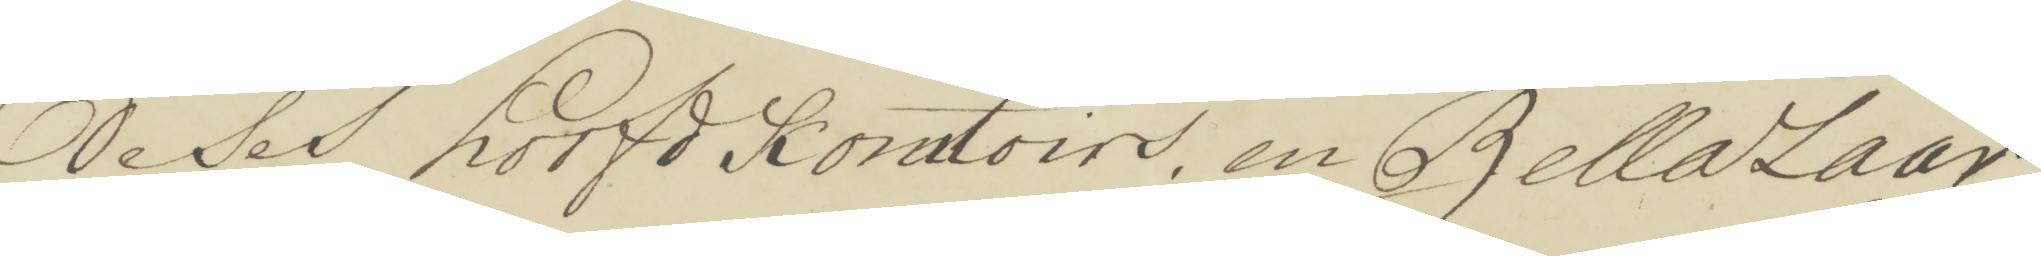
deses hoofd komtoirs, en Bellazaar
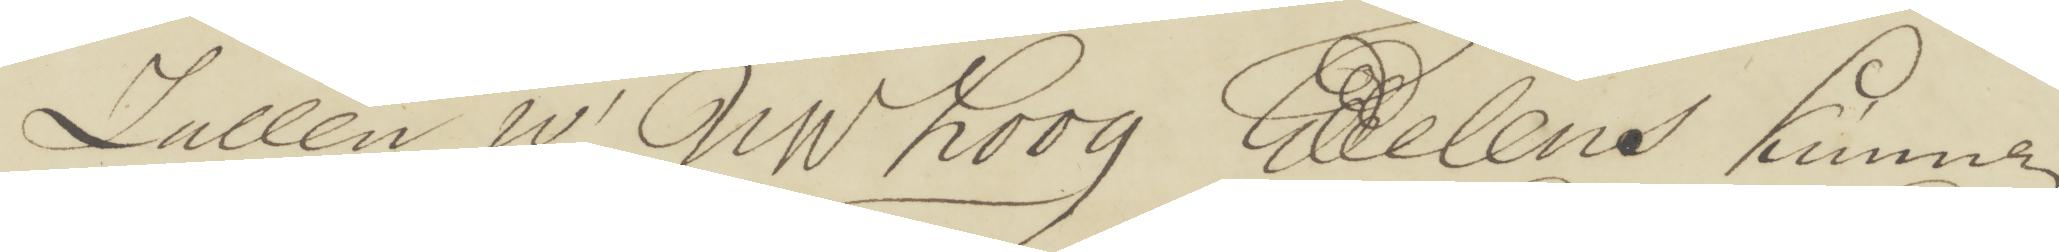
zullen w' uw hoog Edelens kunnen
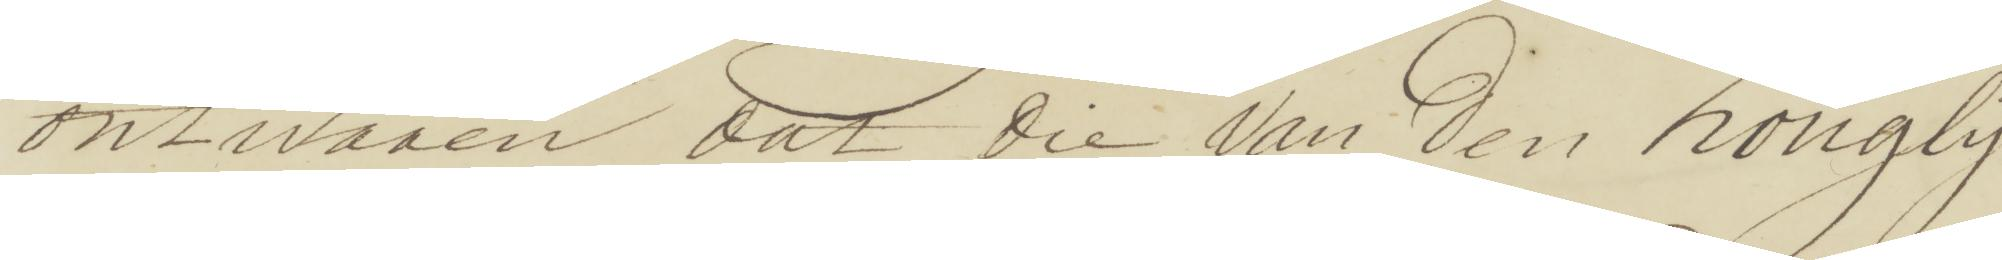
ontwaren dat die van den houglij
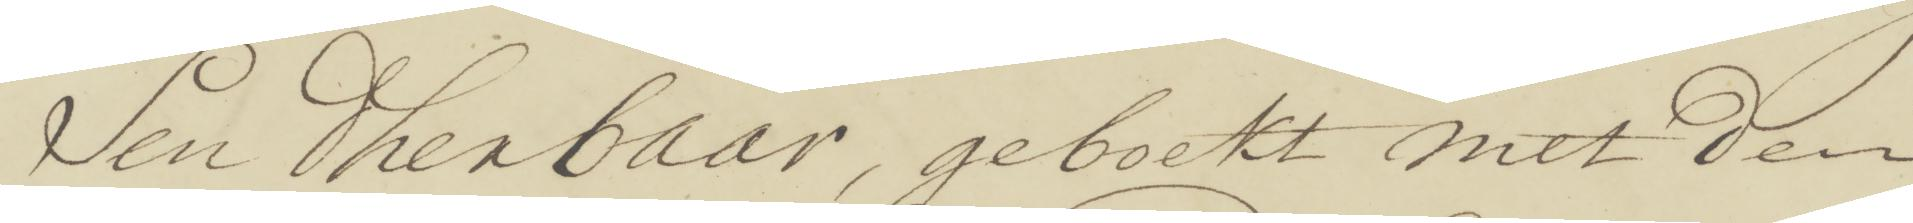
sen dherbaar, geboekt met den
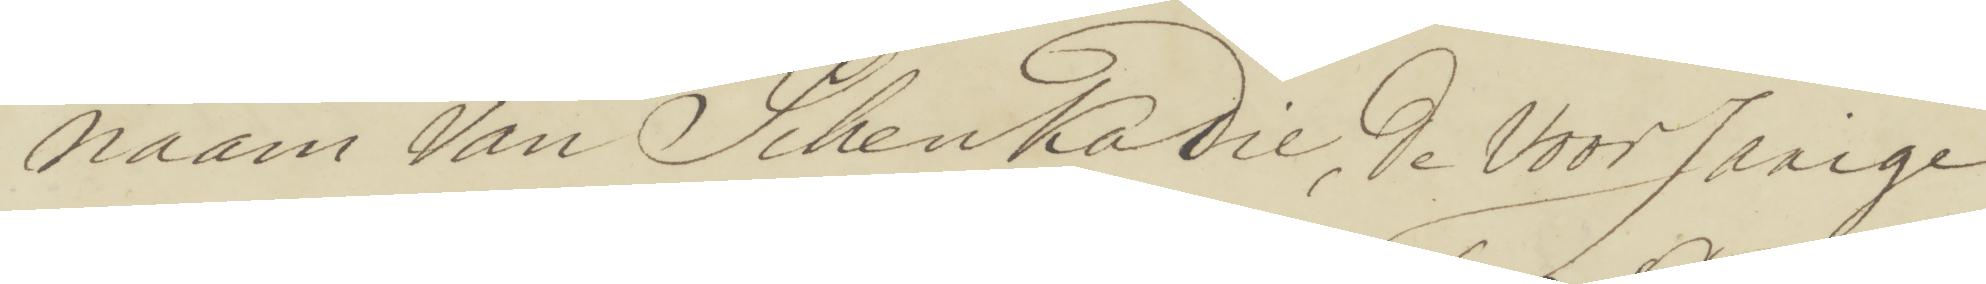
naam van Schenkagie, de voorjarige
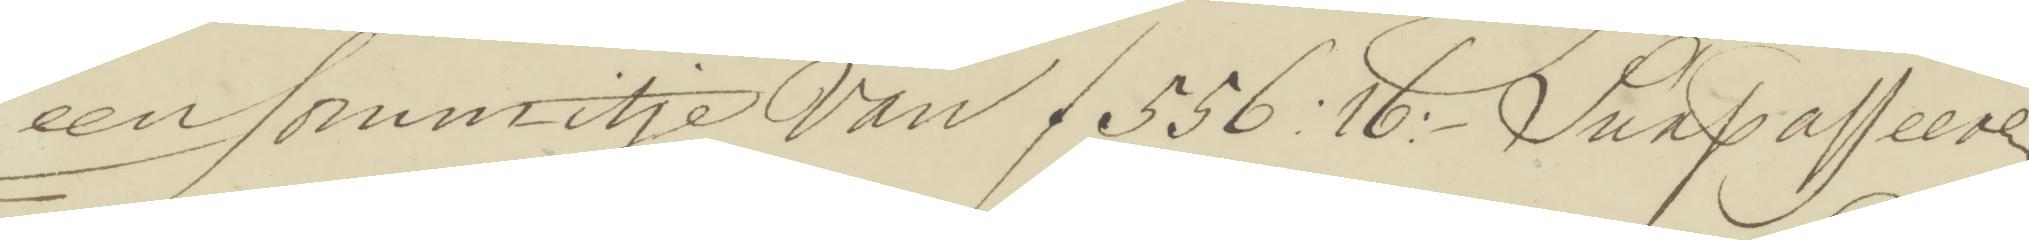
een sommitje van ƒ556: 16: – Surpasseeren
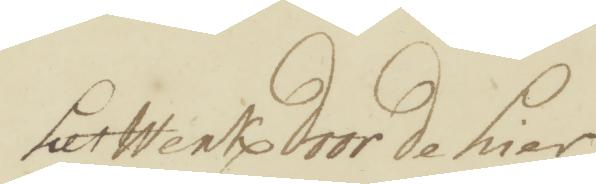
het werk door de hier
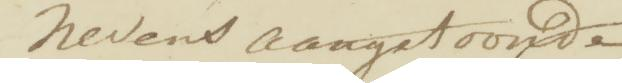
nevens aangetoonde
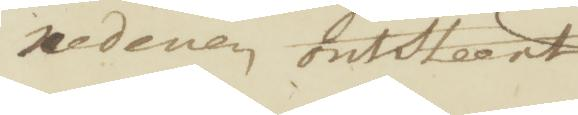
redenen ontstoort
